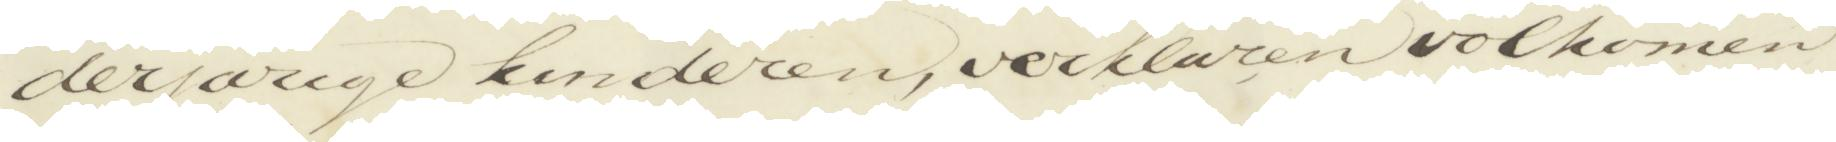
derjarige kinderen, verklaren volkomen
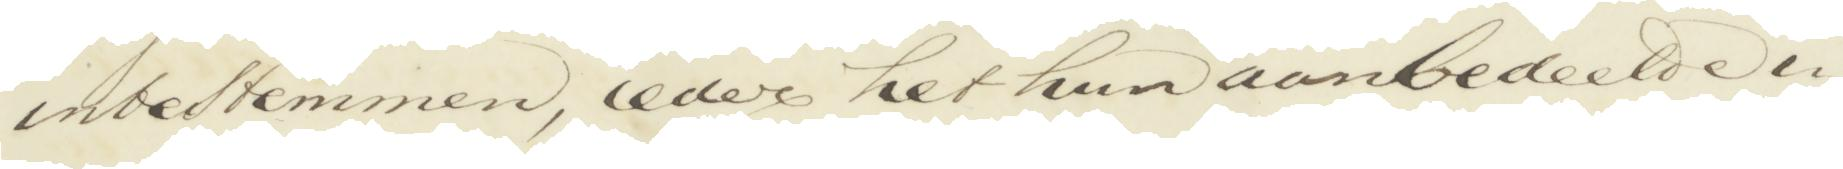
in te stemmen, ieder het hun aanbedeelde in
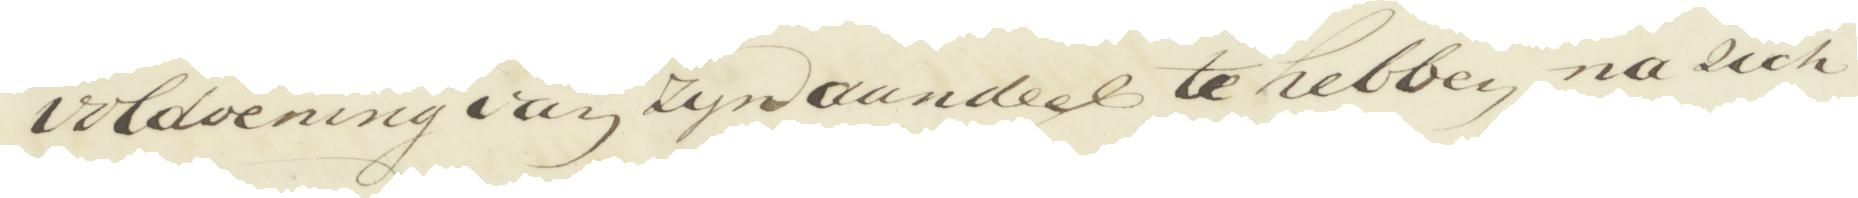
voldoening van zyn aandeel te hebben, na zich
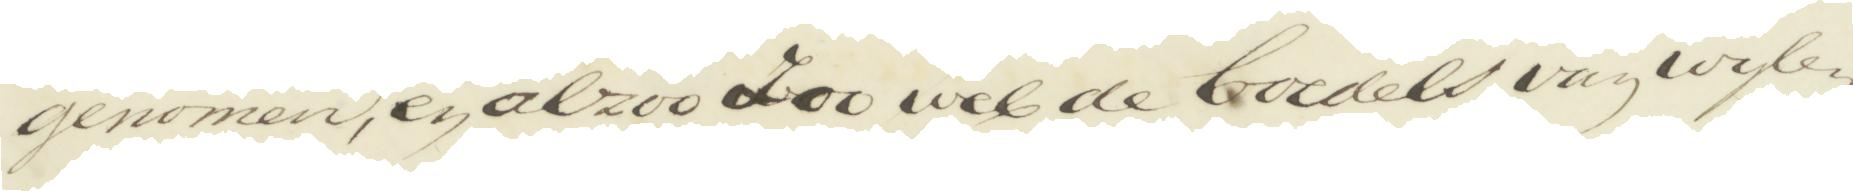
genomen, en alzoo Zoo wel de boedels van wylen
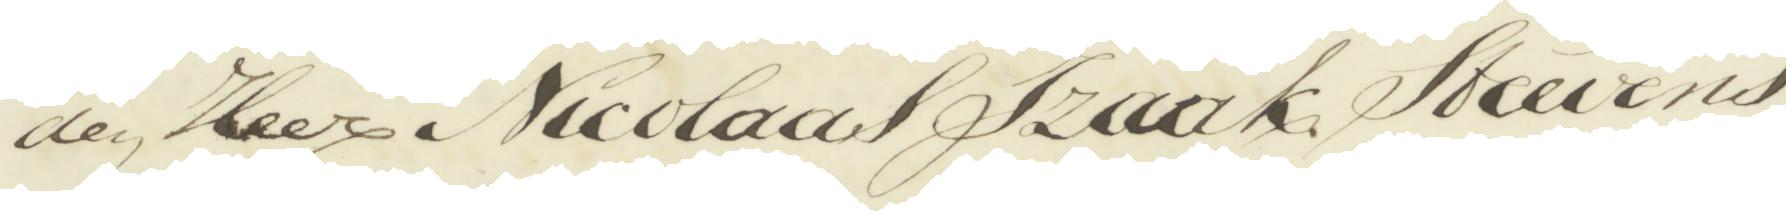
den Heer Nicolaas Izaak Steevens,
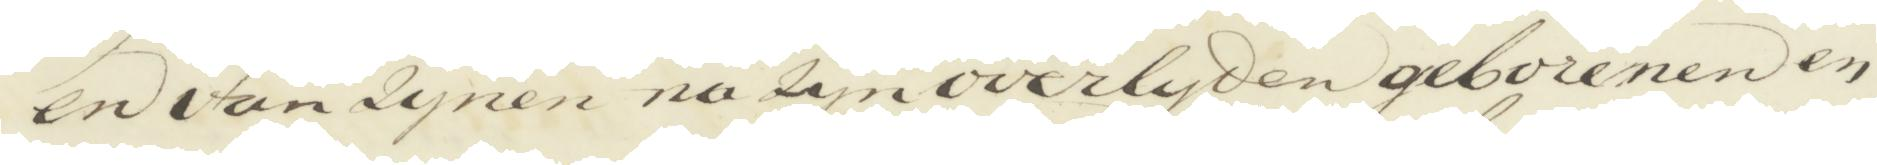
en van zynen na zyn overlyden geborenen en
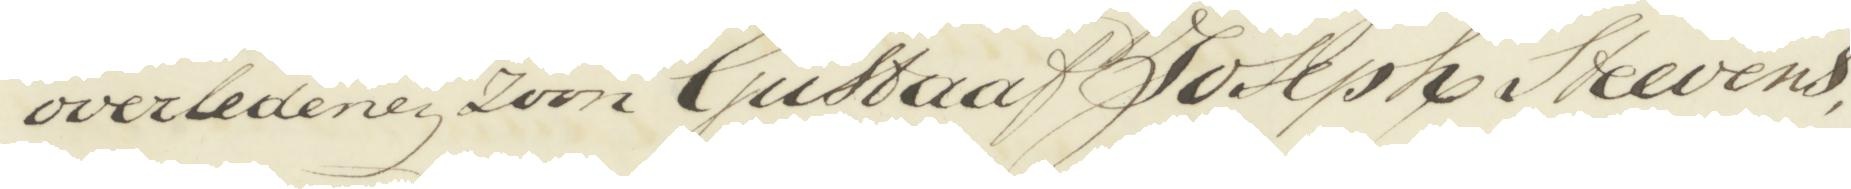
overledenen zoon Gustaaf Ioseph Steevens,
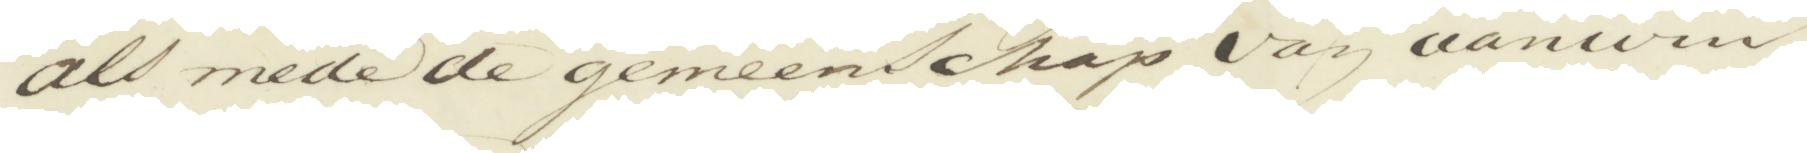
als mede de gemeenschap van aanwin
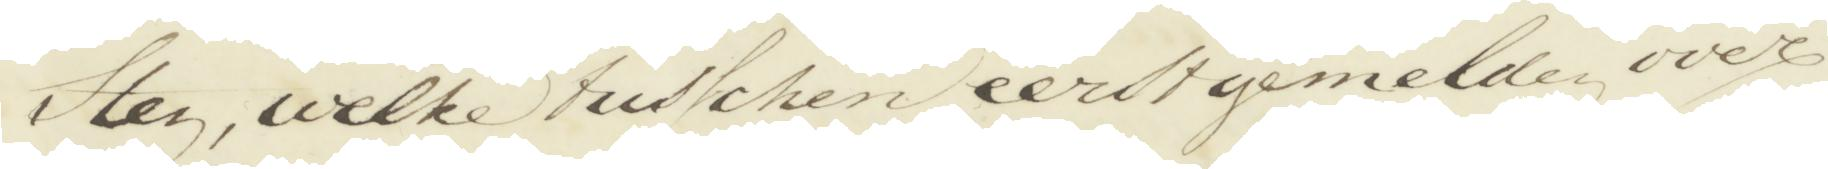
sten, welke tusschen eerstgemelde, over
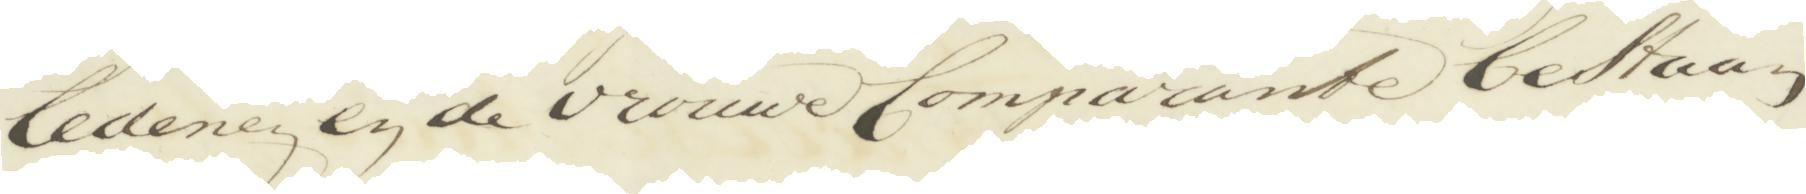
ledenen en de Vrouwe Comparante bestaan
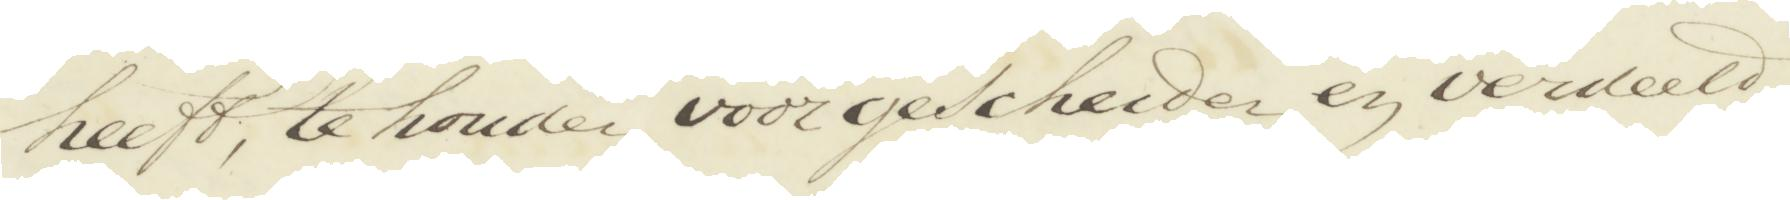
heeft, te houden voorgescheiden en verdeeld,
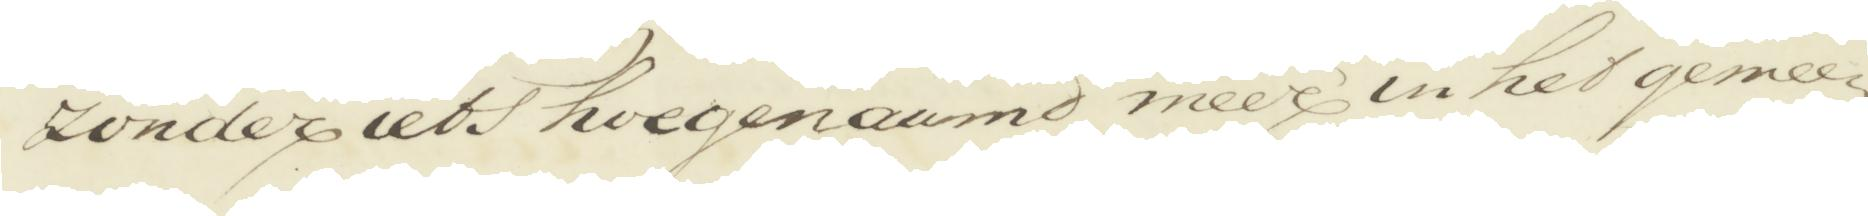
zonder iets hoegenaamd meer in het gemeen
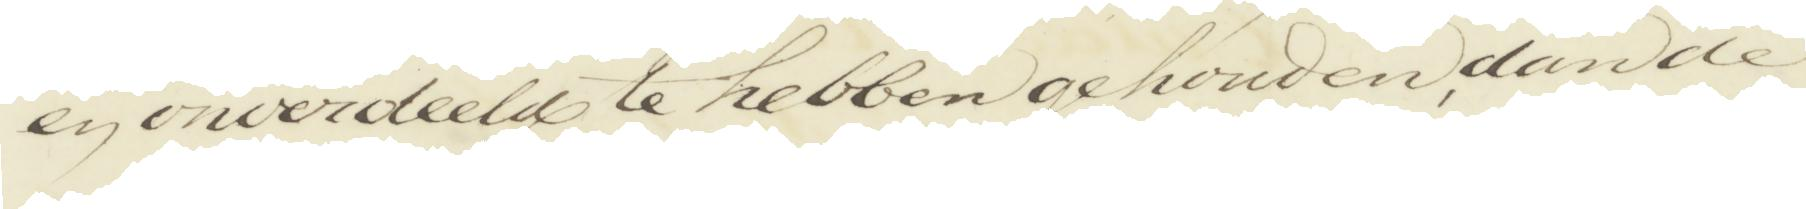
en onverdeeld te hebben gehouden dan de
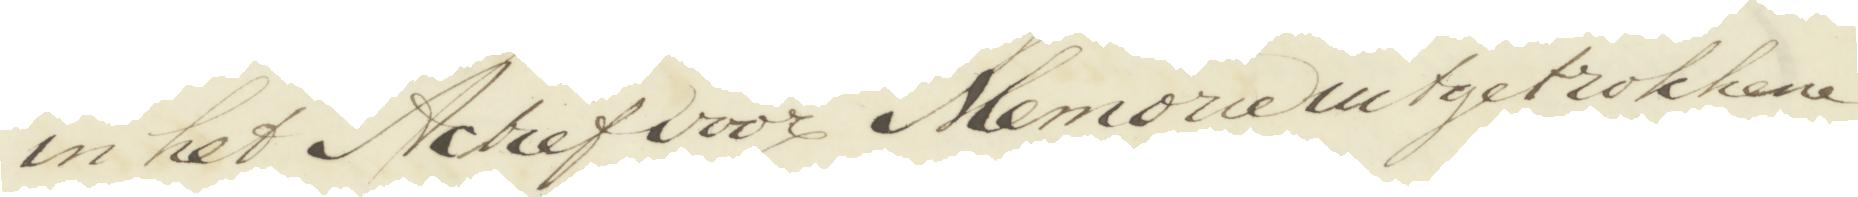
in het Actief voor Memorie uitgetrokkene
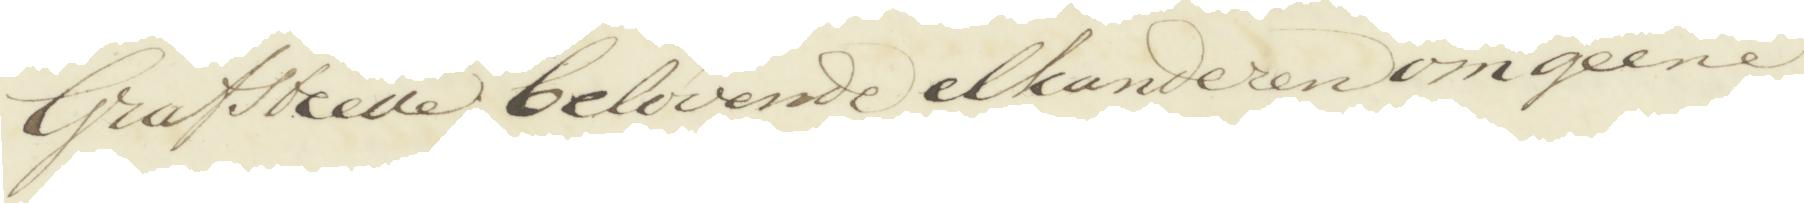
Grafsteede belovende elkanderen om geene
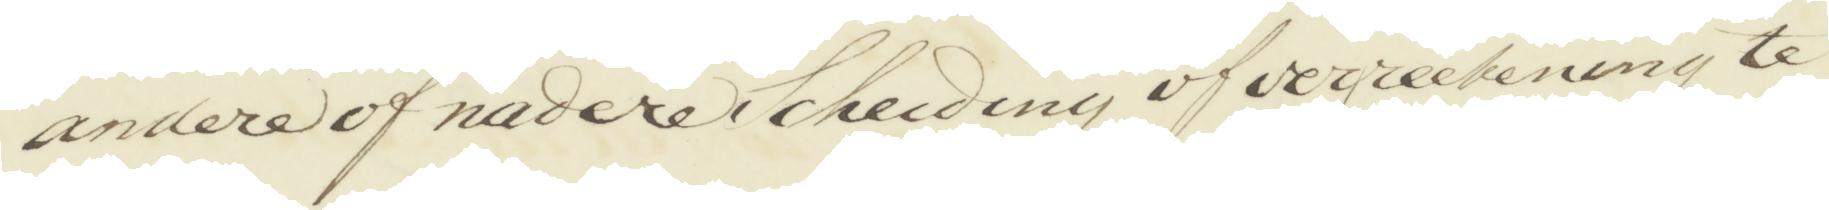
andere of nadere Scheiding of verreekening te
